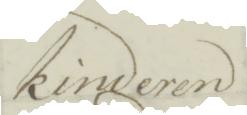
kinderen
